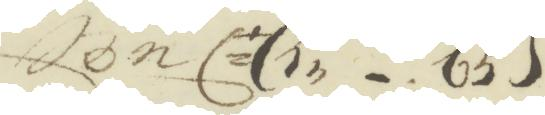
don C=t „ -. 65
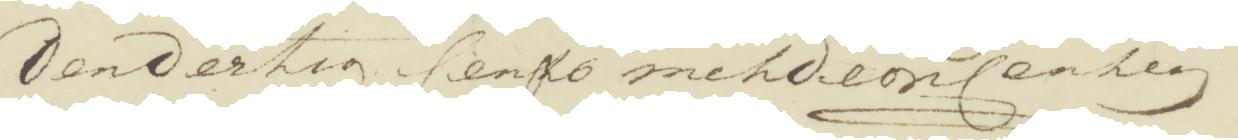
den dertig Cents metdeopcenten
